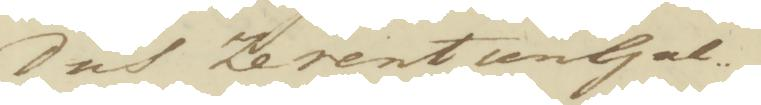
dus Zeventien Gul„
